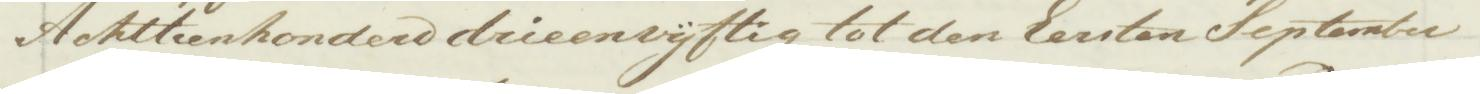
Achttienhonderd drieenvijftig tot den Eersten September
